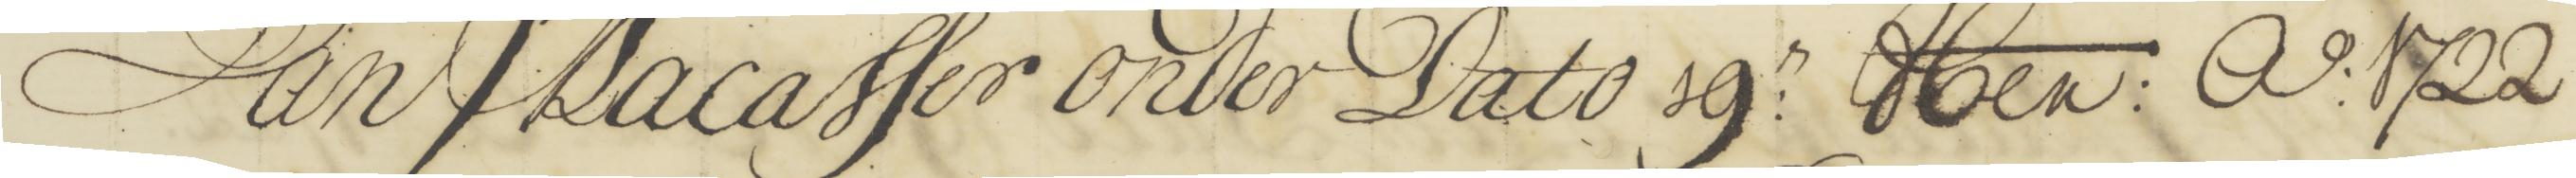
Van Macasser onder Dato 19:en 8ber: A:o 1722
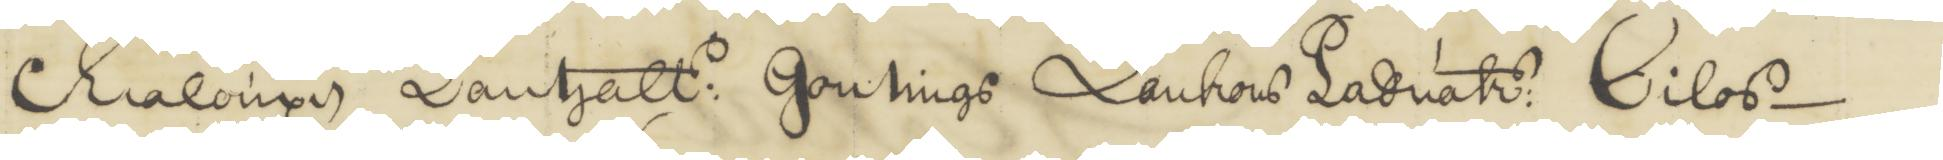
Chialoupen Pantjall:s Gontings Pankons Paduak:s bilos—
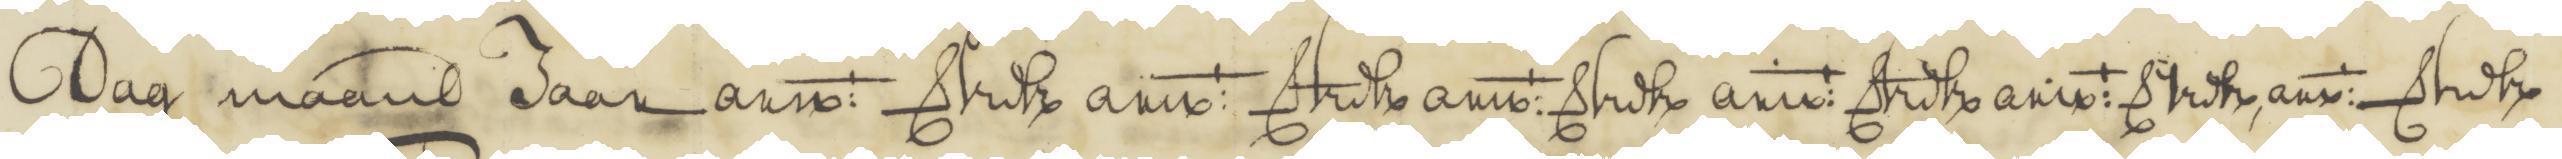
dag maand Iaar ariv:t vertrek ariv:t vertrek ariv:t vertrek ariv:t vertrek ariv:t vertrek, arv:t vertrek
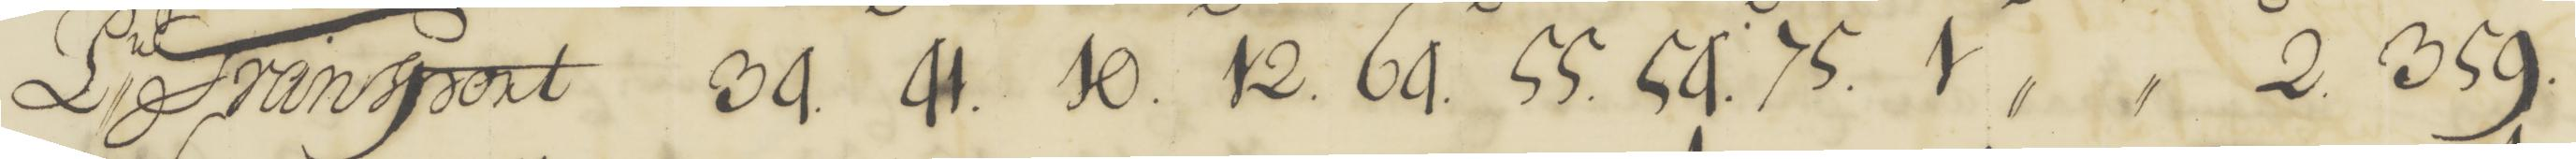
P„r Transport 34. 41. 10. 12. 64. 55. 54. 75. 1 „ „ 2. 359.
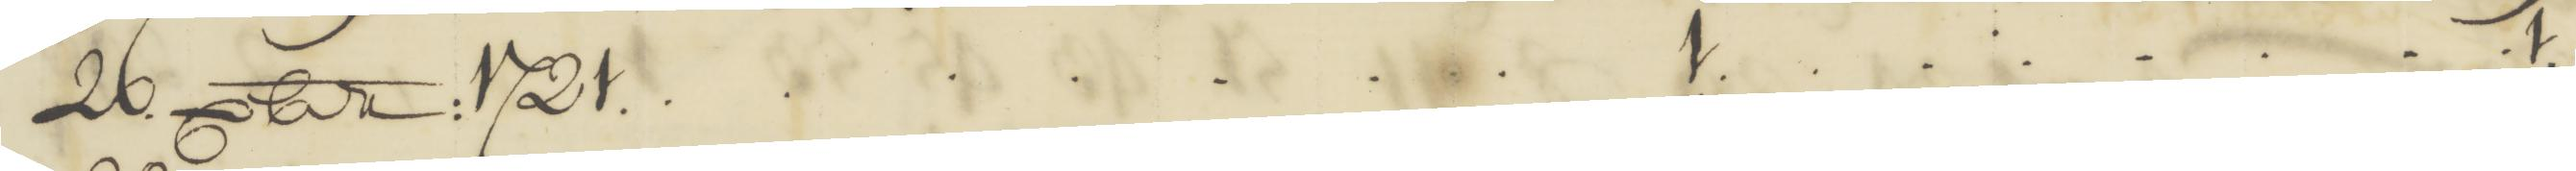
26. xber: 1721 . . . . . . . . 1. . . . . . . . 1.
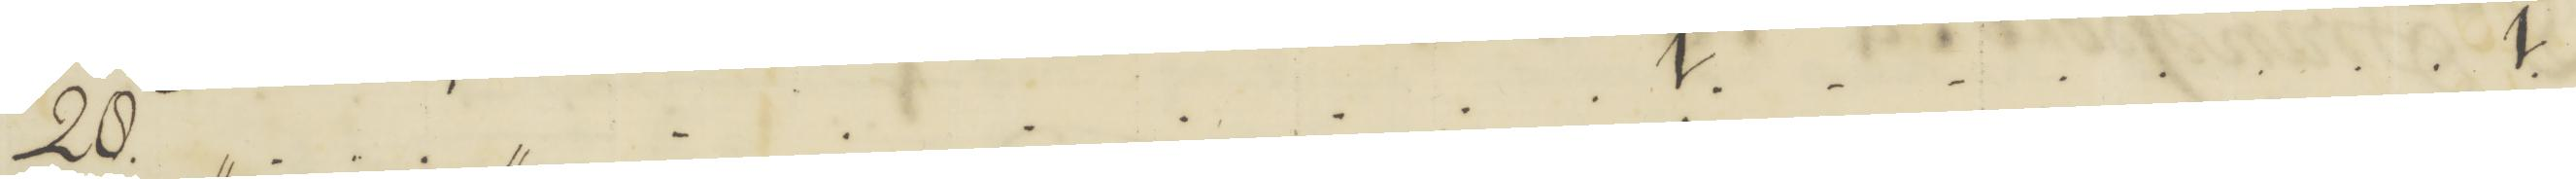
28. „ . . . „ - . . . . . . 1. - - . . . . . 1.
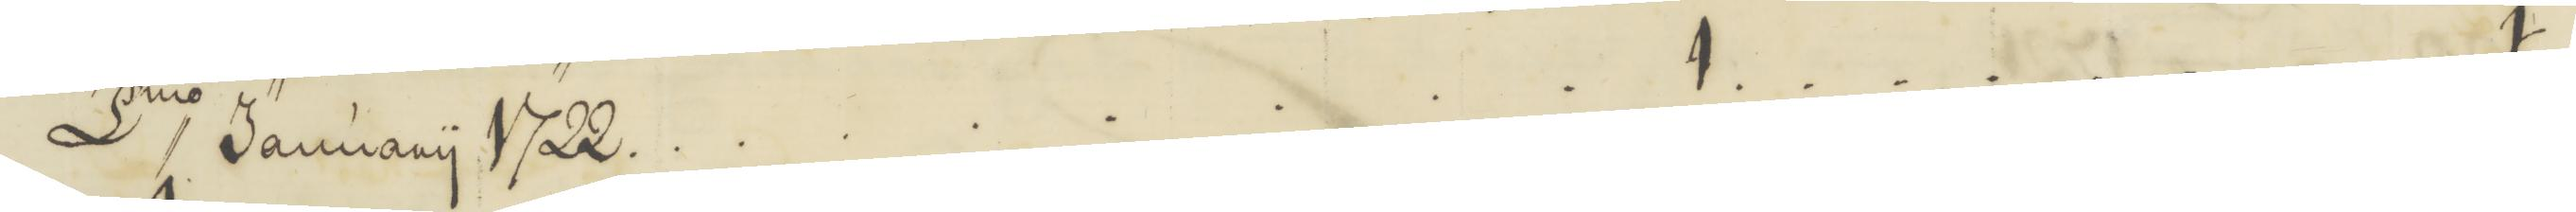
P„mo Ianuarij 1722. . . . . . . . . 1. . . . . . . . 1.
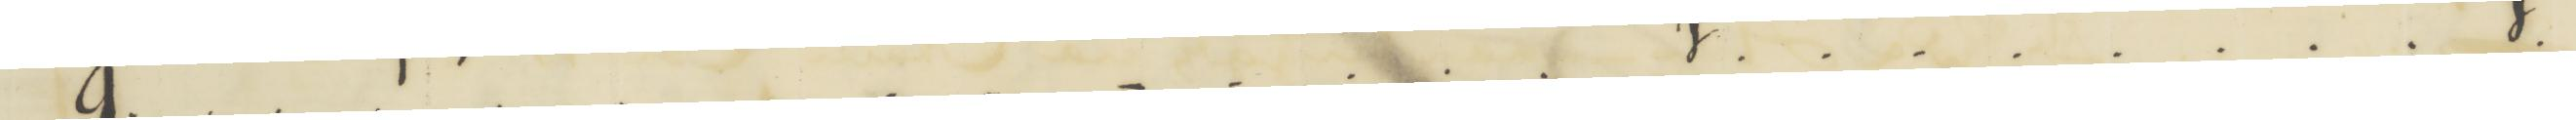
4. . . . . . . . . . . - - . . . 1 . . . . . . . . 1.
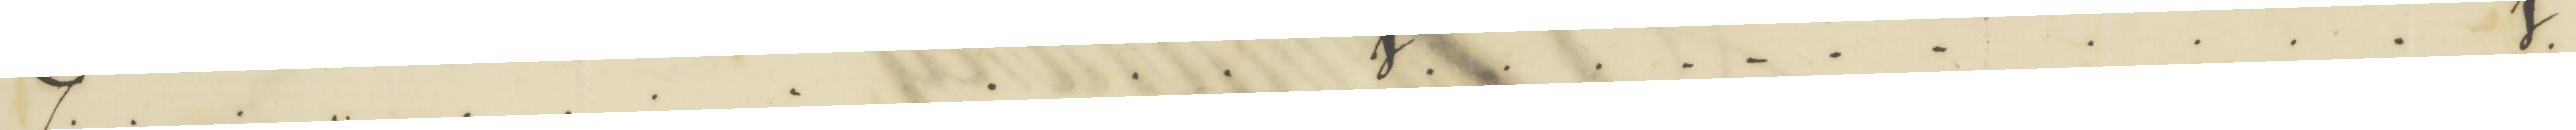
7. . . . . . . . . . . . 1. . . . - . . . . . . 1.
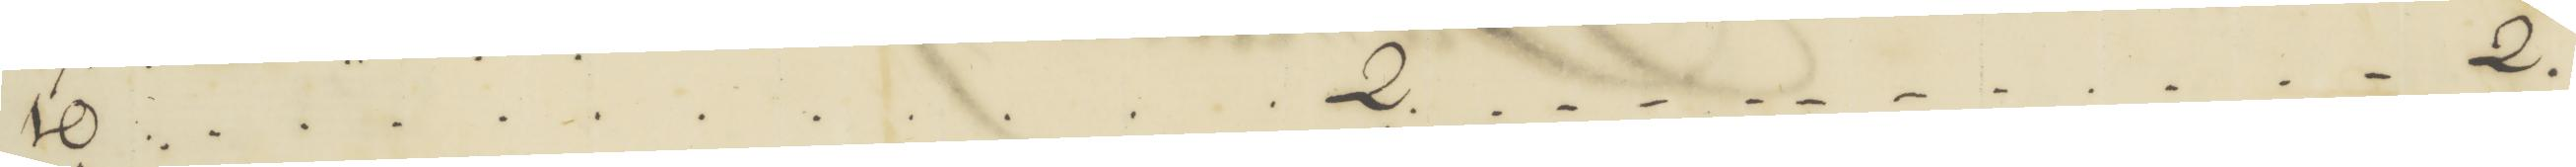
10 . . . . . . . . . . . . . 2. . - - - - - - . . . - 2.
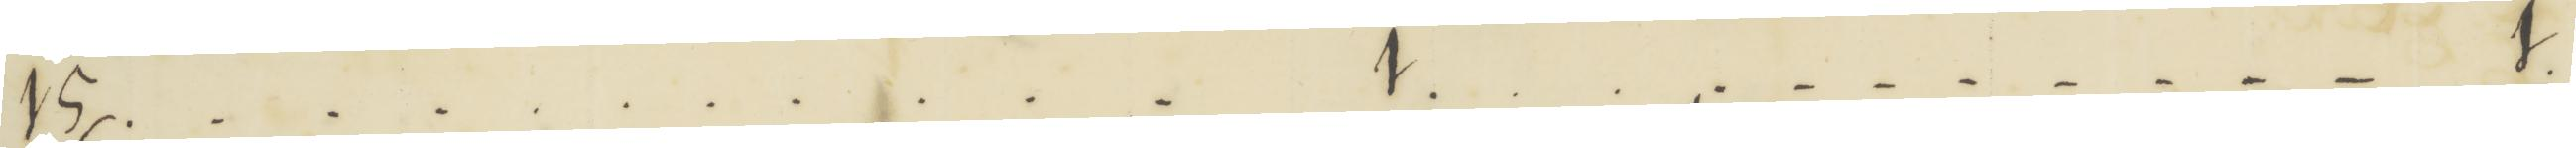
15. . . . . . . . . . - 1. . . . - - - - - - - 1.
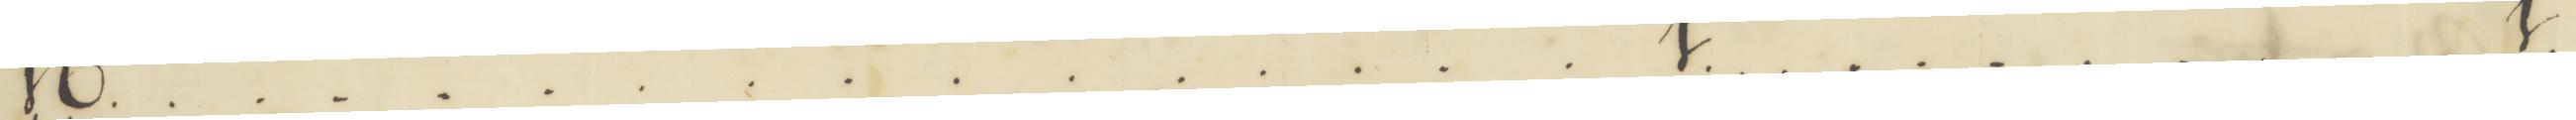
16. . . . . . . . . . . . . . . . 1. . . . . . . . . . . 1.
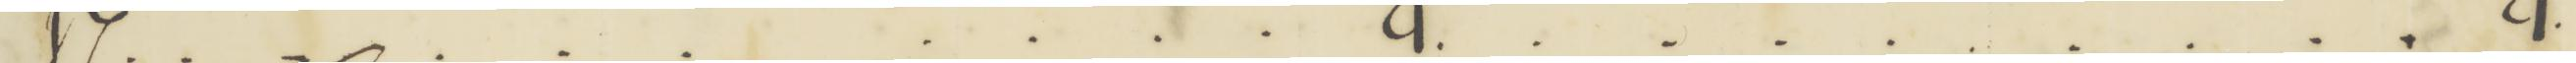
17. . - . . . . . . . 4. . . . . . . . . . 4.
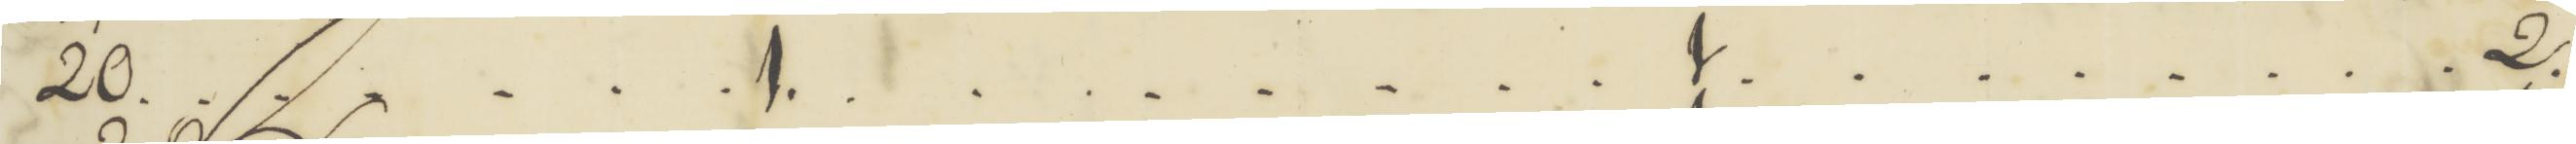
20. . . . . . . 1. . . . . . . . . 1. . . . . . . . 2.
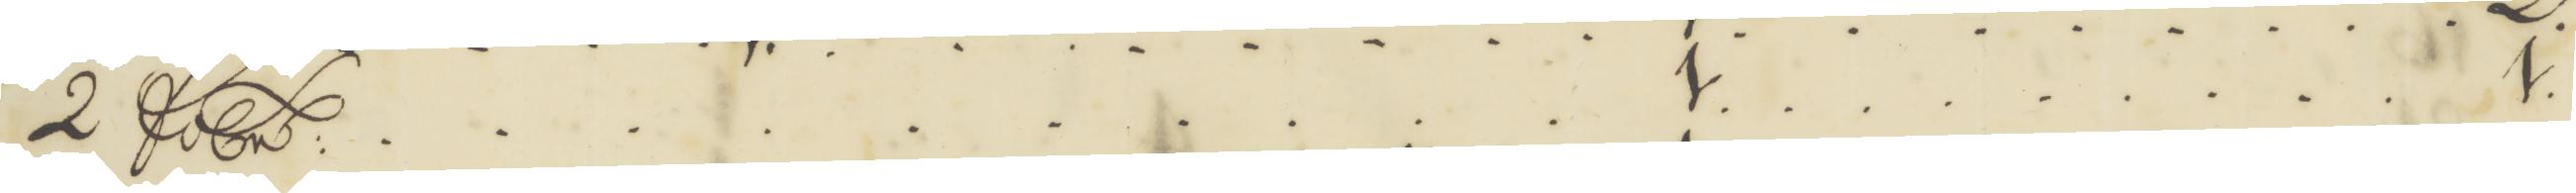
2 febr: . . . . . . . . . . 1. . . . . . . . . 1.
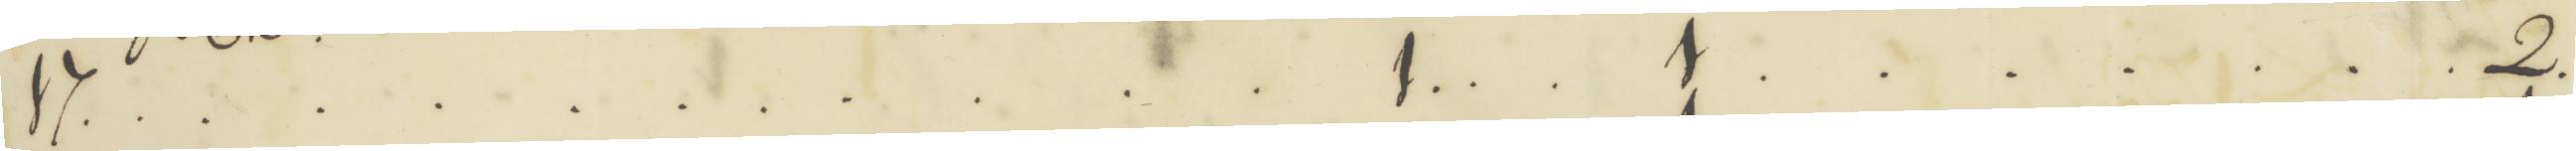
17. . . . . . . . . . . . 1. . . 1 . . . . . . . 2.
